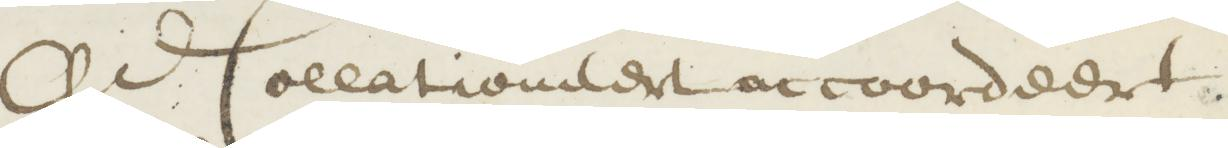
gecollationtert accoordeert
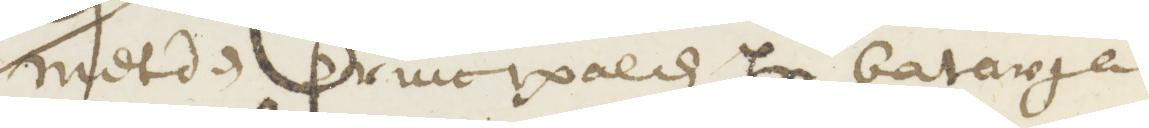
met den principalen Jn batavja
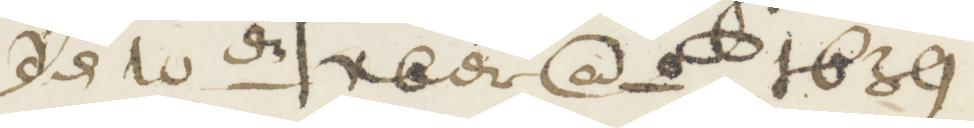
den 10-en xber @-o. 1639
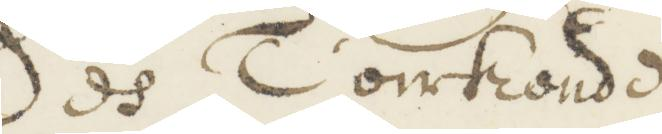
Des T'oirkonde
